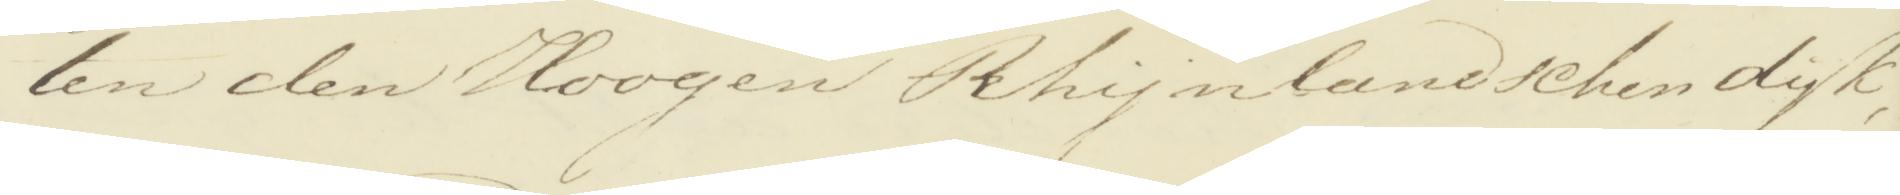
ten den Hoogen Rhijnlandschen dijk,
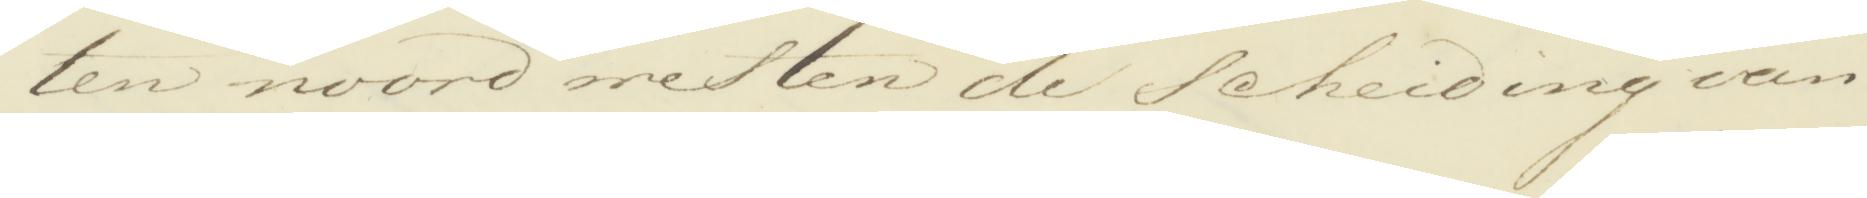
ten noord westen de scheiding van
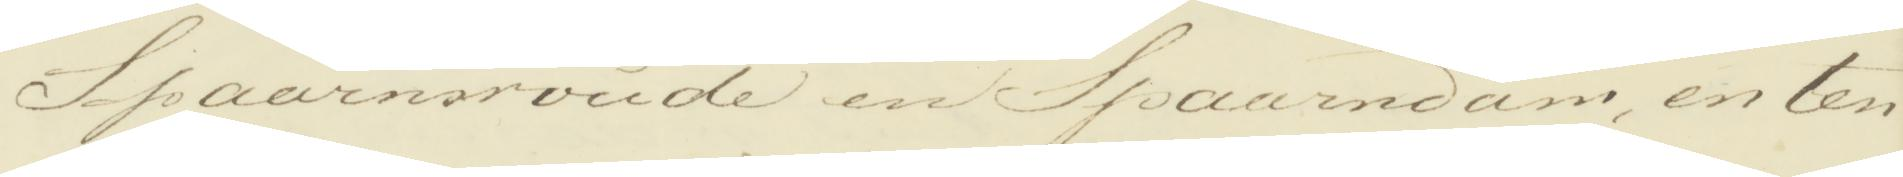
Spaarnwoude en Spaarndam, en ten
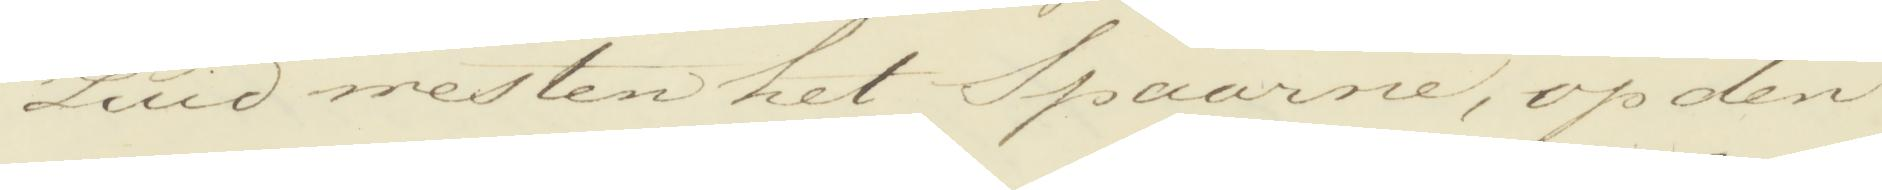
zuid westen het Spaarne, op den
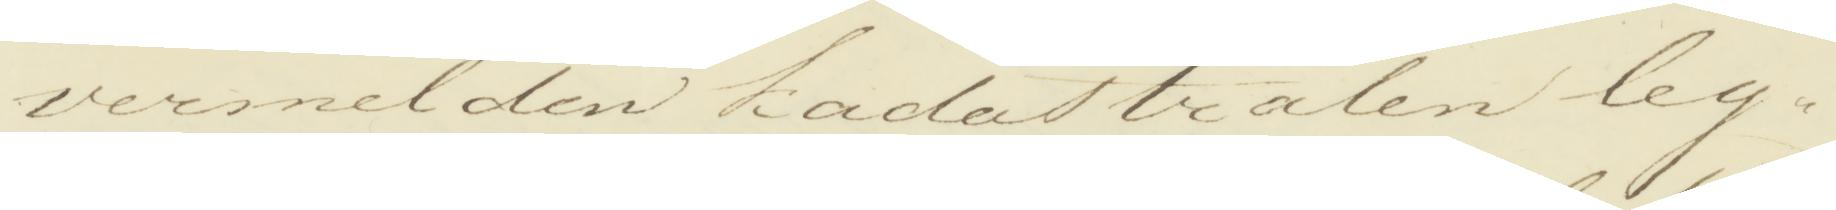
vermelden kadastralen leg„
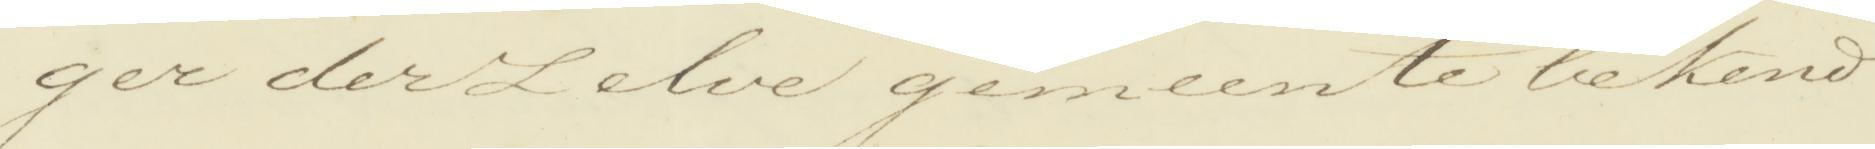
ger derzelve gemeente bekend
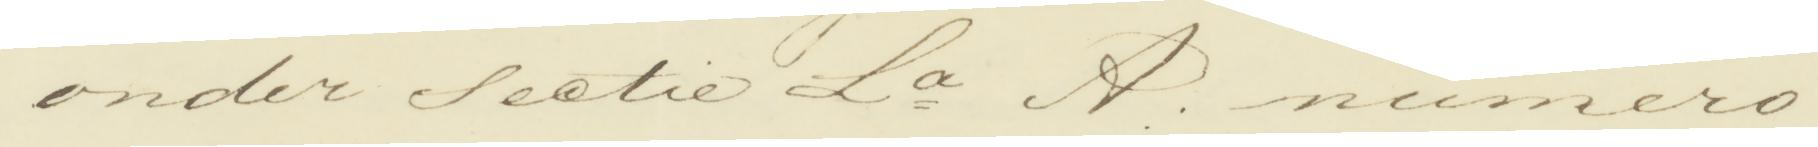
onder sectie L=a A: numero
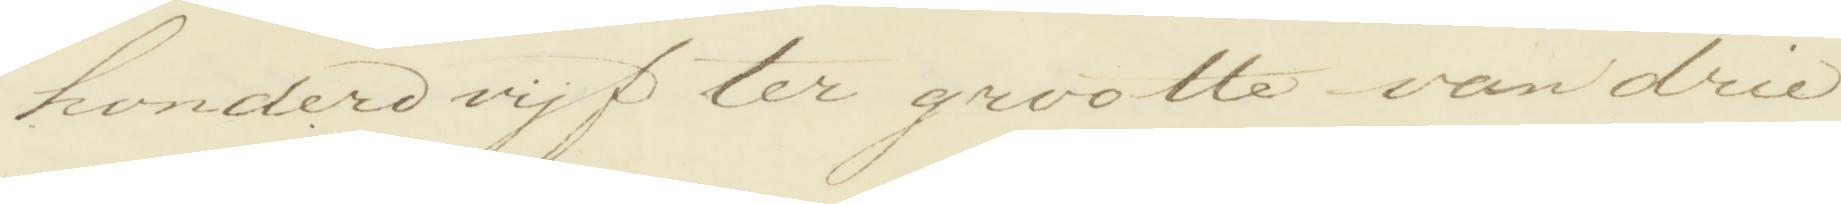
honderd vijf ter grootte van drie
